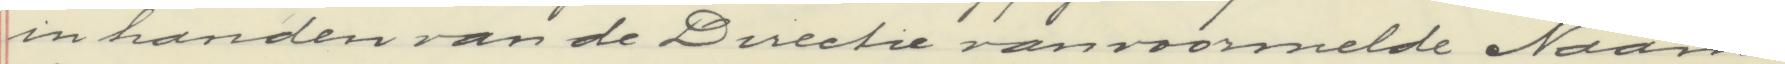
in handen van de Directie van voormelde Naam
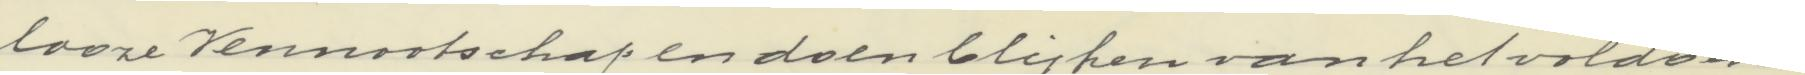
looze Vennootschap en doen blijken van het voldoen
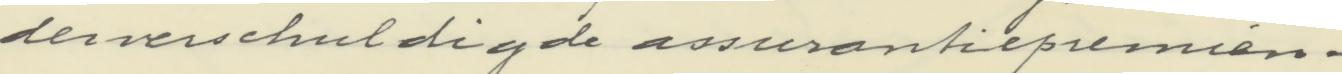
der verschuldigde assurantiepremien
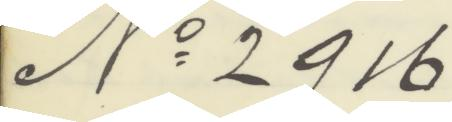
N=o 2916
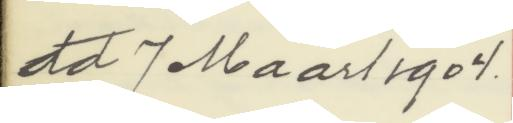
dd 7 Maart 1904.
